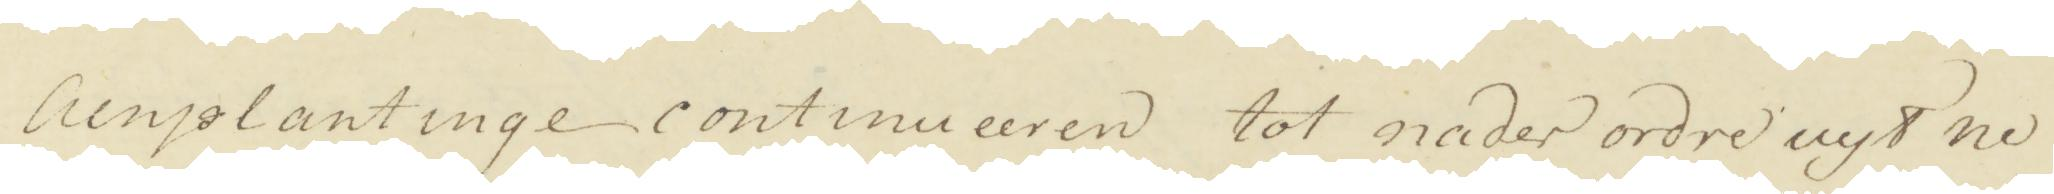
Aenplantinge continueeren tot nader ordre uyt ne
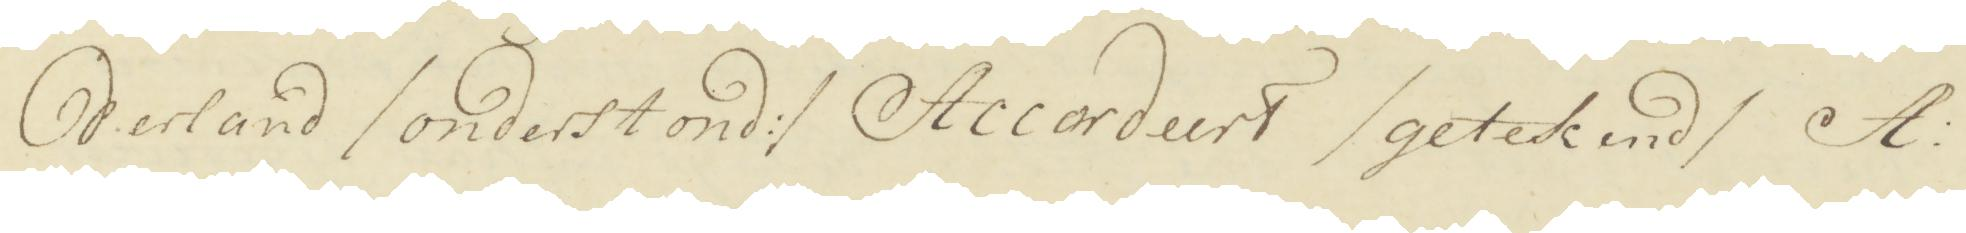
derland / onderstond:/ Accordeert / getekend/ A:
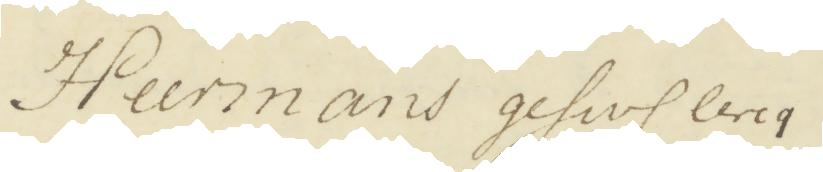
Heermans gesw Clercq
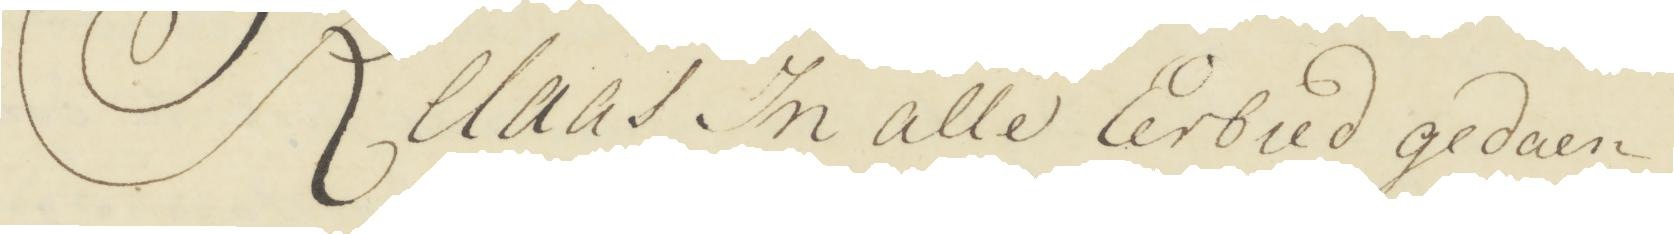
Relaas In alle Eerbied gedaen
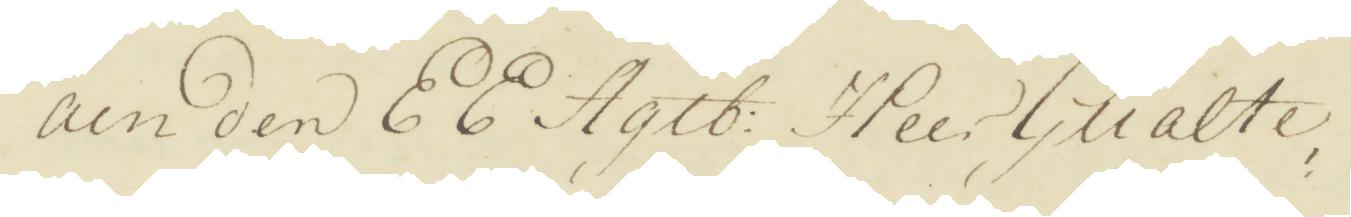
aen den EE Agtb: Heer Gualte„
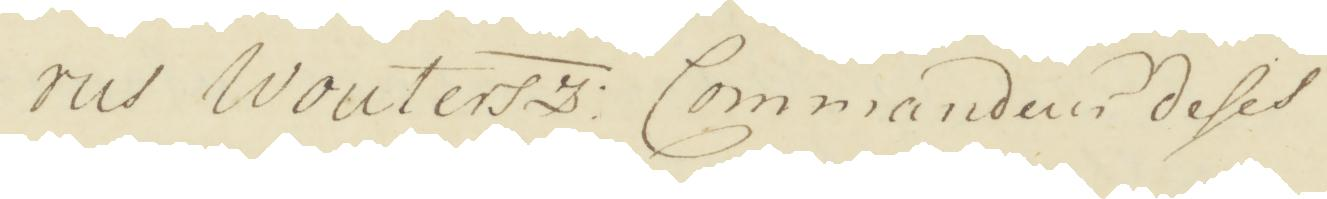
rus Woutersz: Commandeur deses
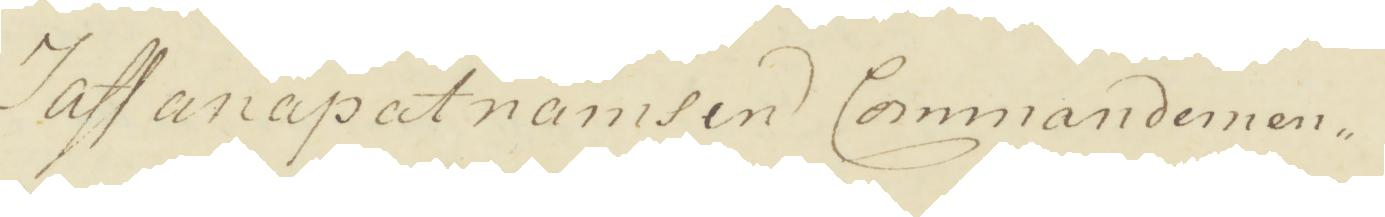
Iaffanapatnamsen Commandemen„
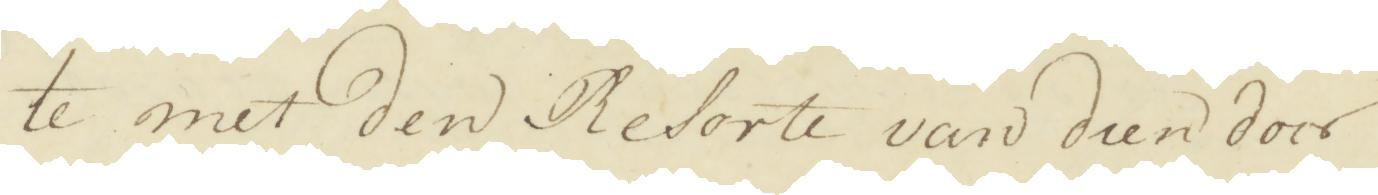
te met den Resorte van dien door
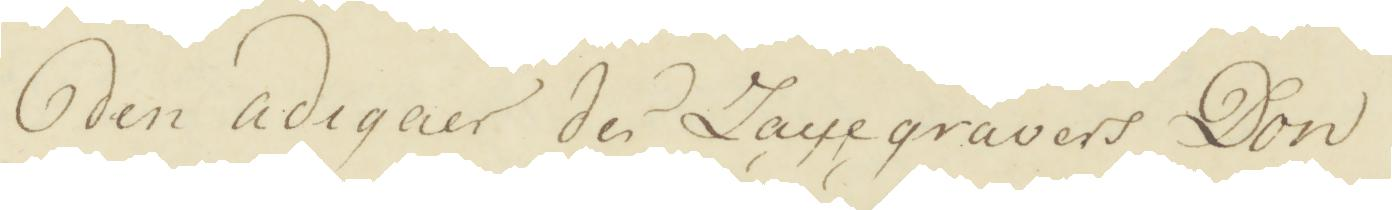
den adigaer der Zaye gravers Don
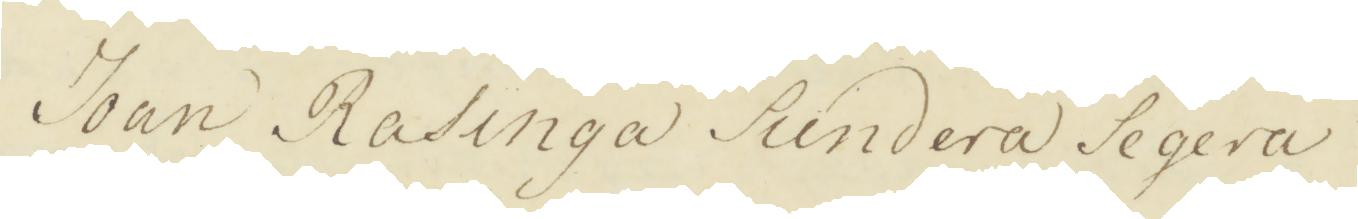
Ioan Rasinga Sundera Segera
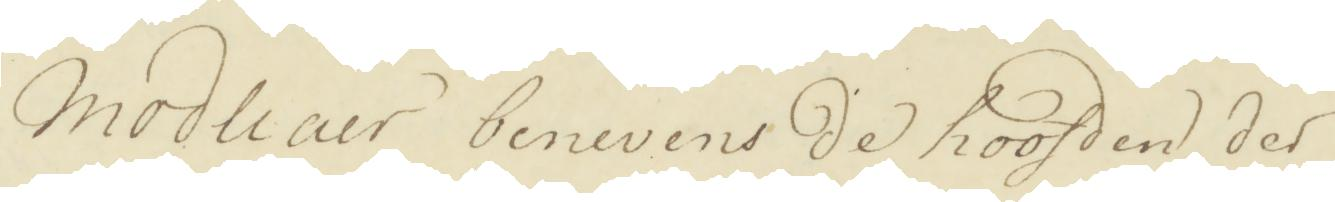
Modhaer benevens de hoofden des
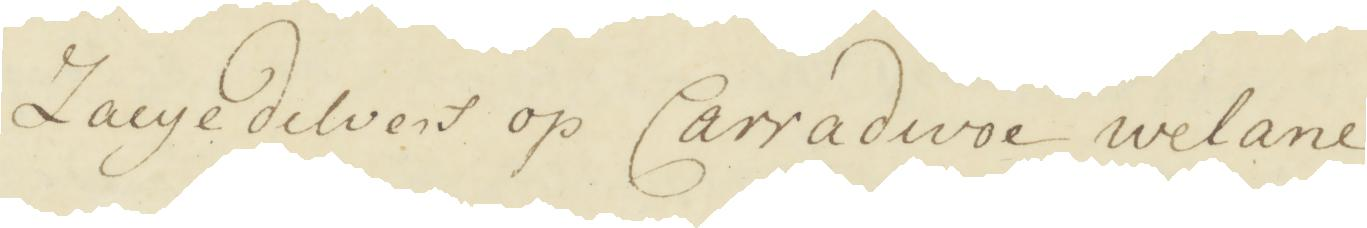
Zaeye delvers op Carradivoe welane
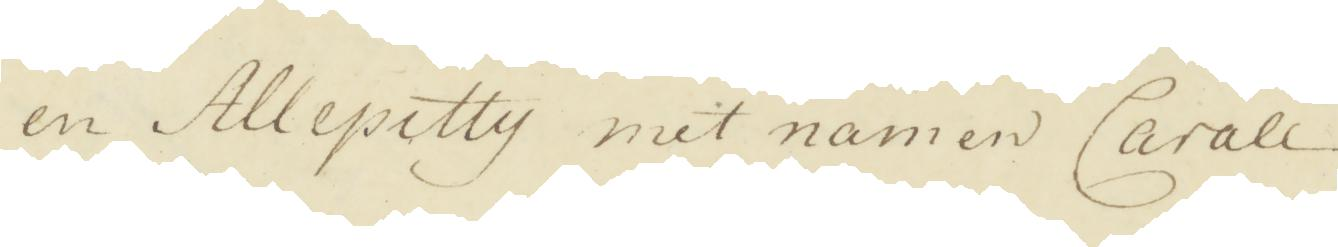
en Allepittij met namen Carale
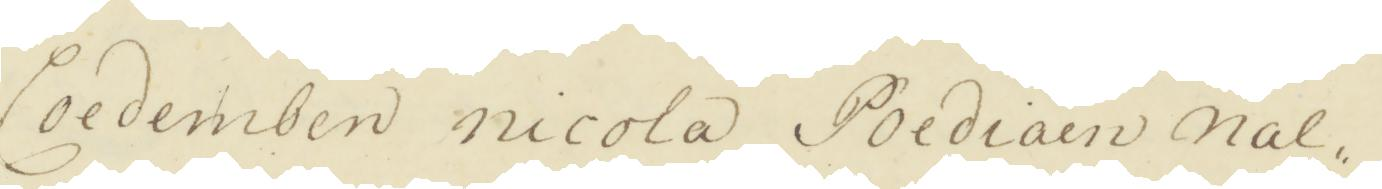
Coedemben nicola Poediaen nal„
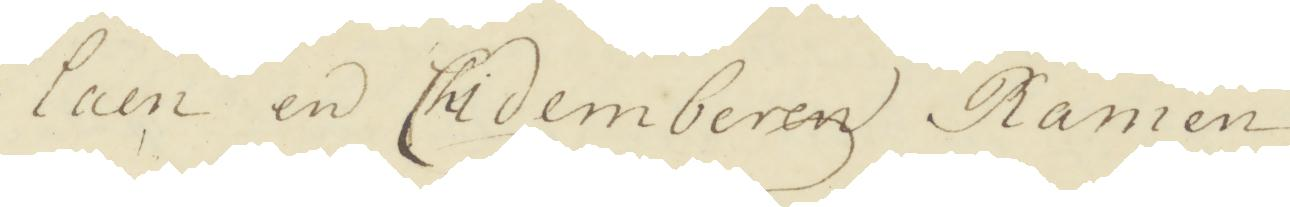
laen en Chidemberen Ramen
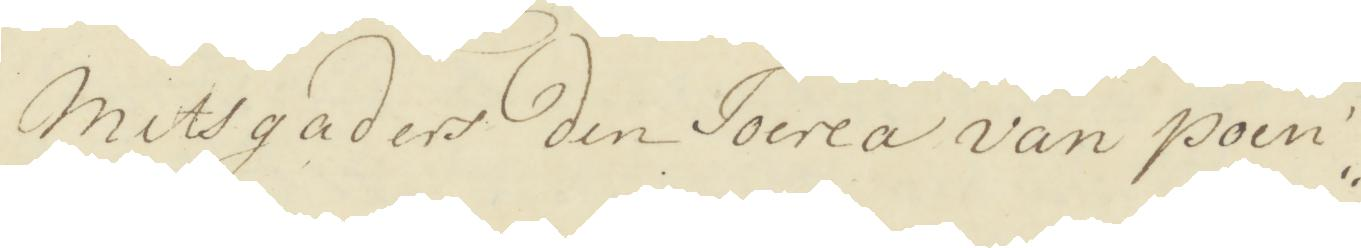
mitsgaders den Toerea van poen„
